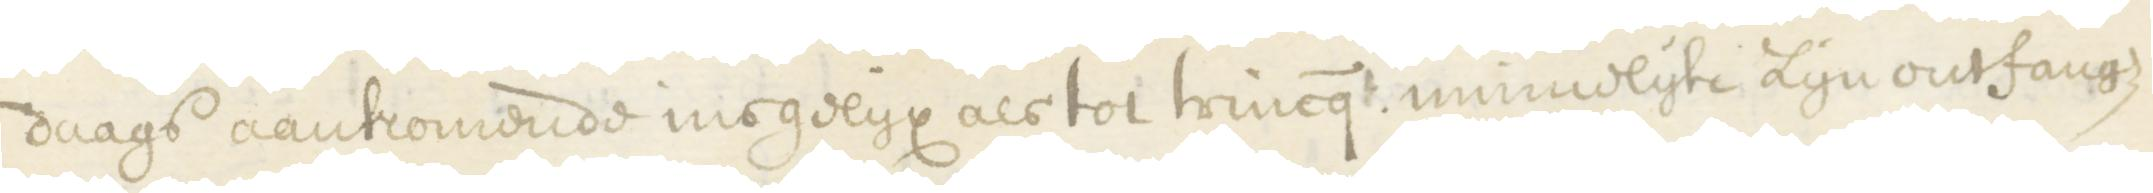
daags aankomende insgelijx als tot trincq: minnelijk zijn ontfangen
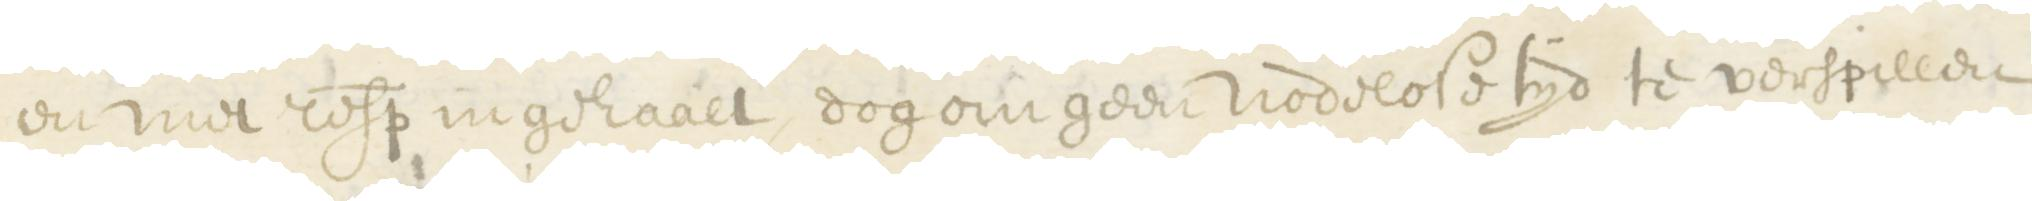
en met resp ingehaalt dog om geen nodelose tijd te verspillen
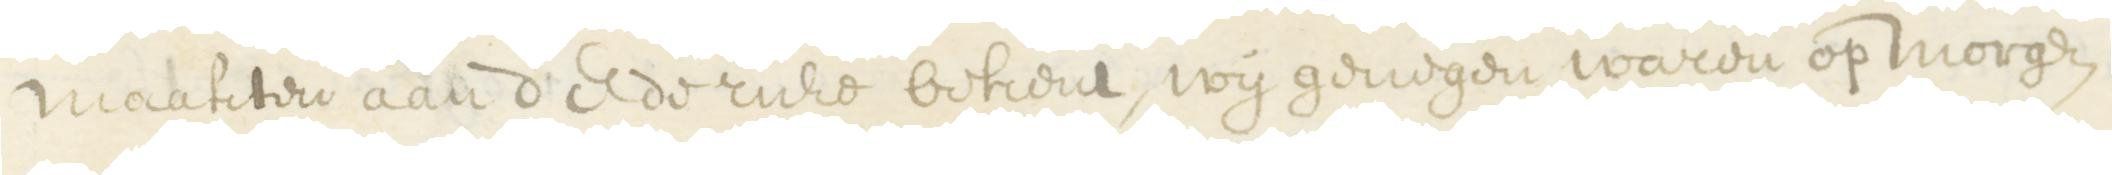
maakten aan d’ Ederuhe bekent, wij genegen waren op morgen
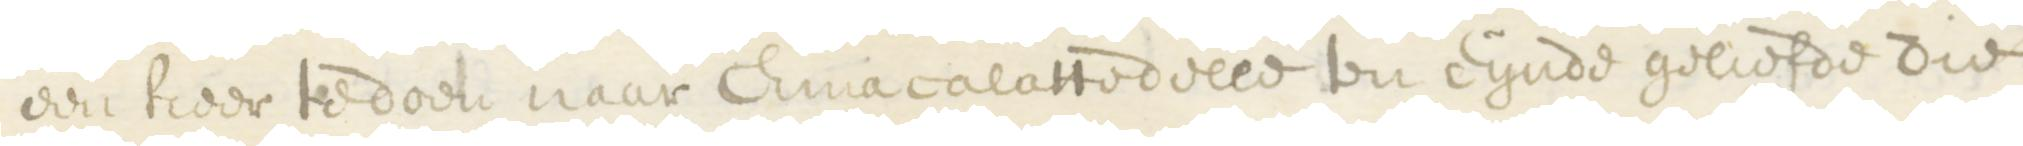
een keer te doen naar chinacalattedelle ten eijnde geliefde die
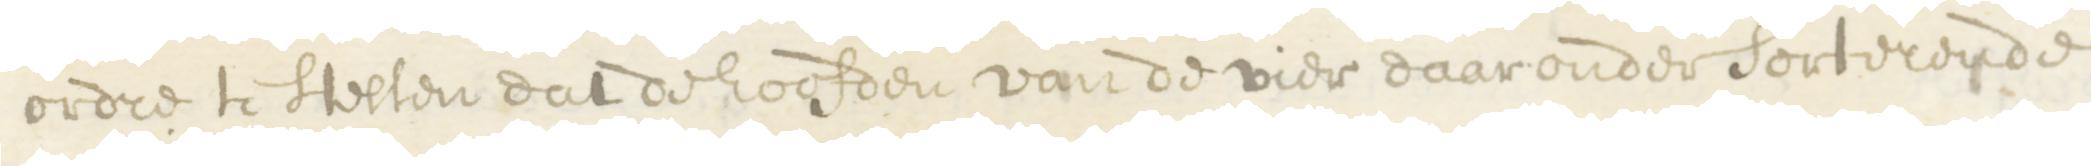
ordre te stellen dat de hoofden van de vier daar onder sorterende
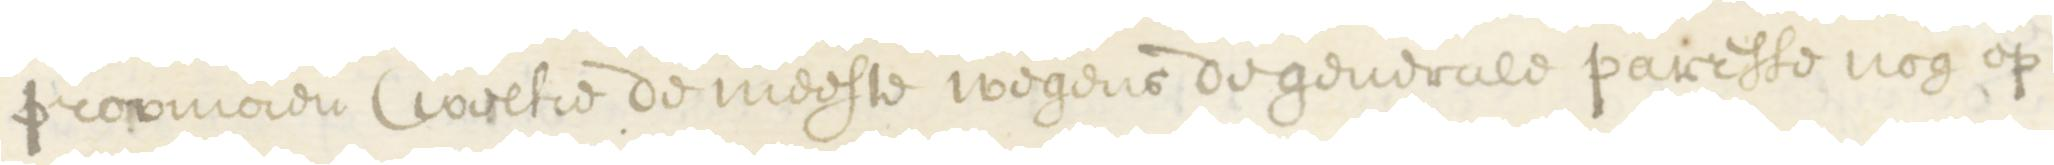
provincien (welke de meeste wegens de generale paicresse nog op
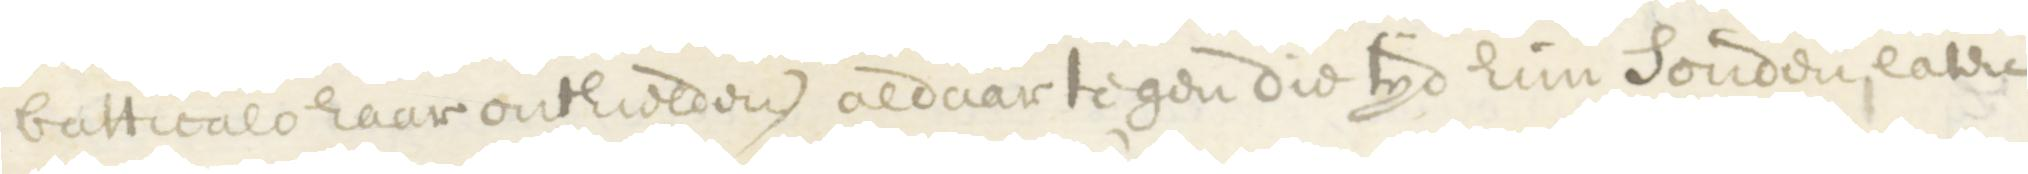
batticalo haar onthielden) aldaar tegen die tijd hun souden laten
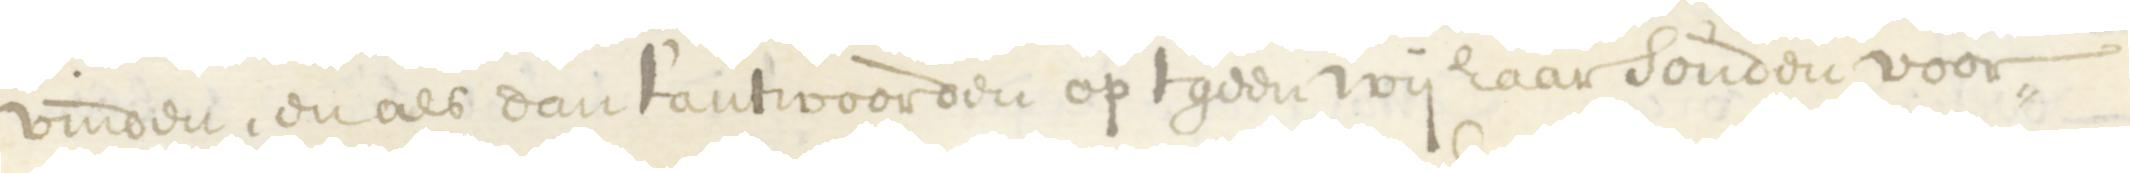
vinden, en als dan t'antwoorden op ’tgeen wij haar souden voor„
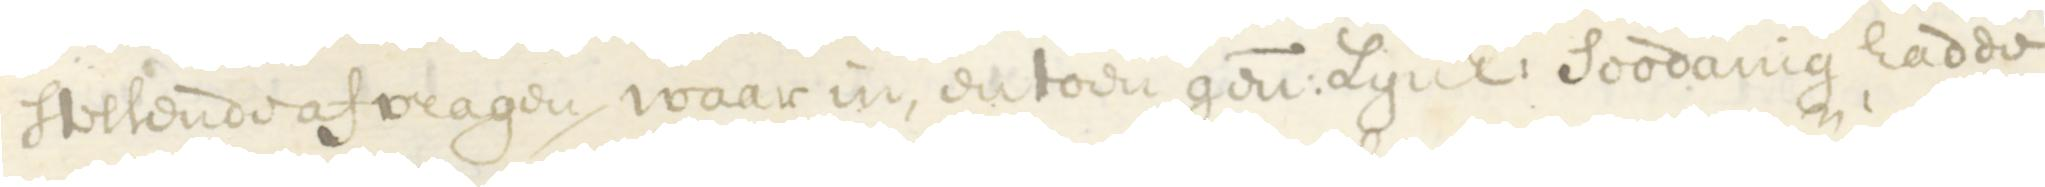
stellende afvragen, waar in, en toen gen: zijn E: soodanig hadde
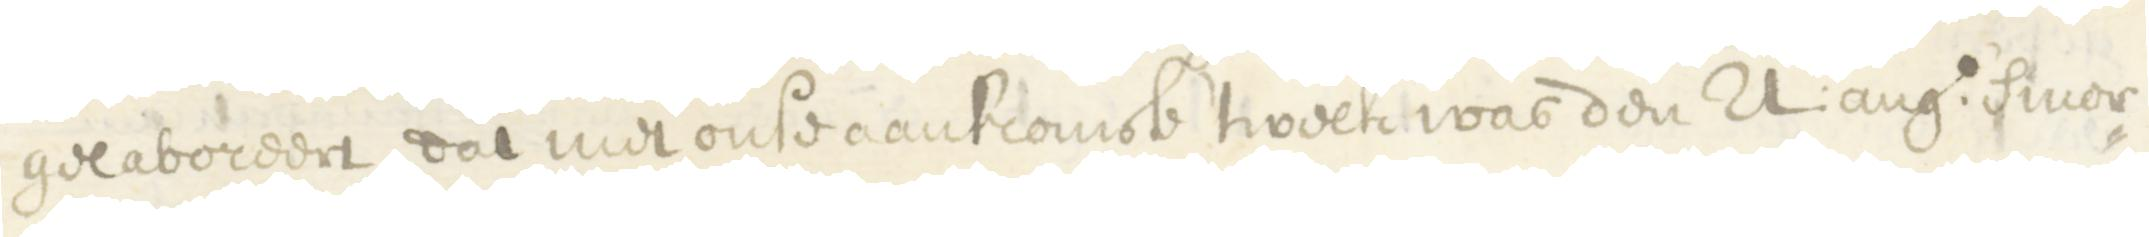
gelaboreert, dat met onse aankomste 'twelk was den 21:' aug.o smor„
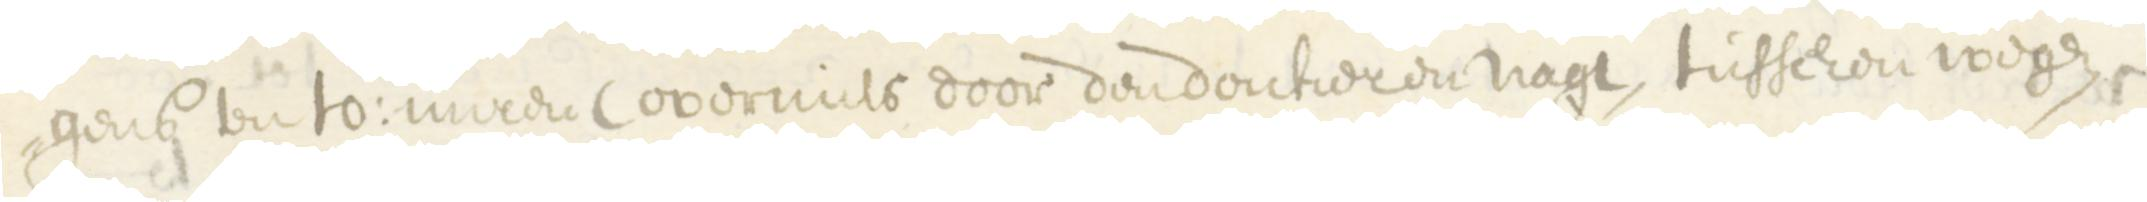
gens ten 10: uuren (overmits door den donkeren nagt, tusschen wegen
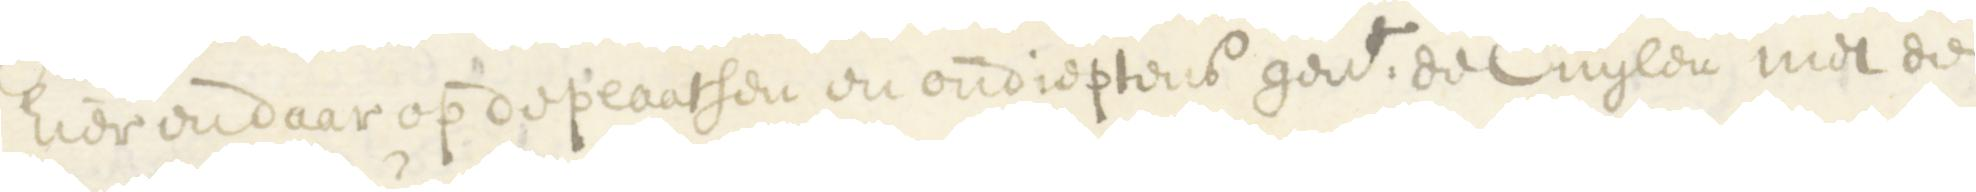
hier en daar op de plaatsen en ondieptens gen:t de Cuijlen met de
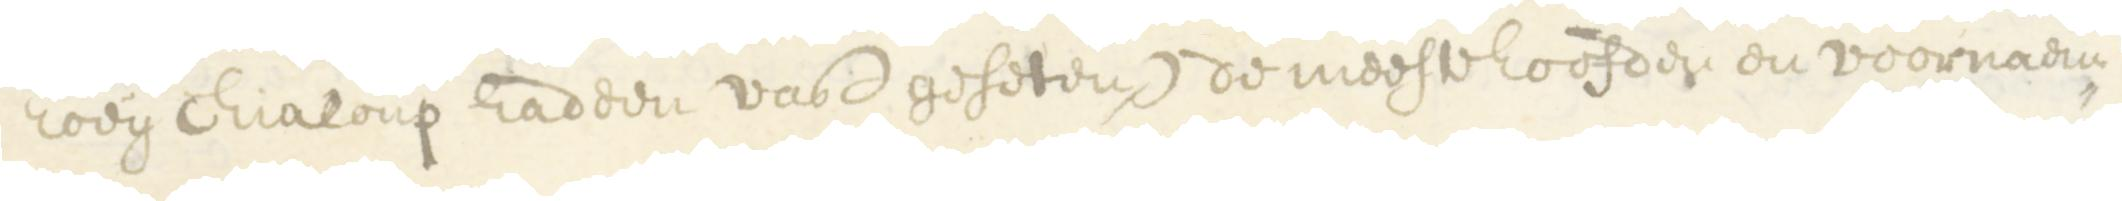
roeij chialoup hadden vast geseten) de meeste hoofden en voornaem
